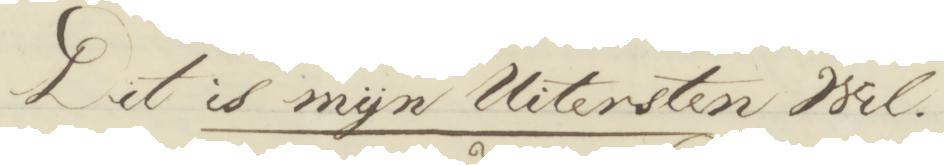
Dit is mijn Uitersten Wil.
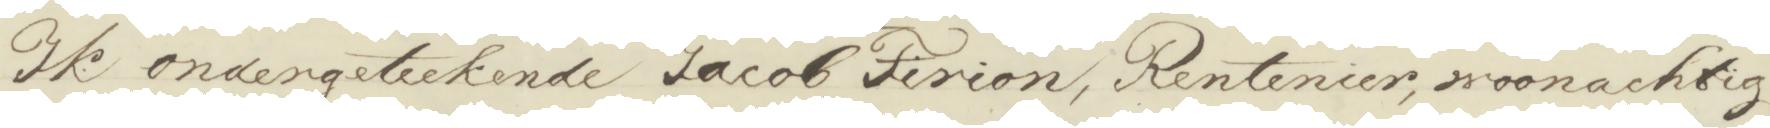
Ik ondergeteekende Iacob Firion, Rentenier, woonachtig
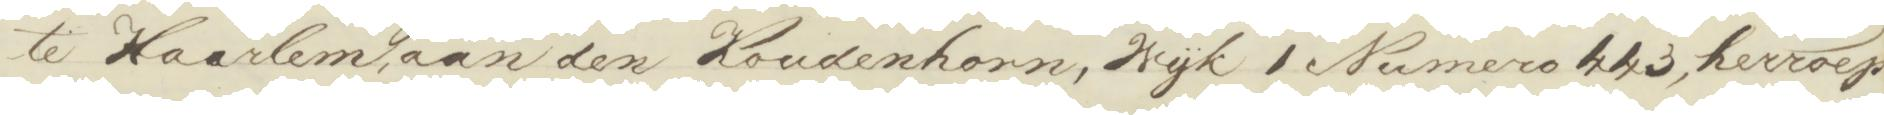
te Haarlem, aan den Koudenhorn, Wijk 1 Numero 443, herroep
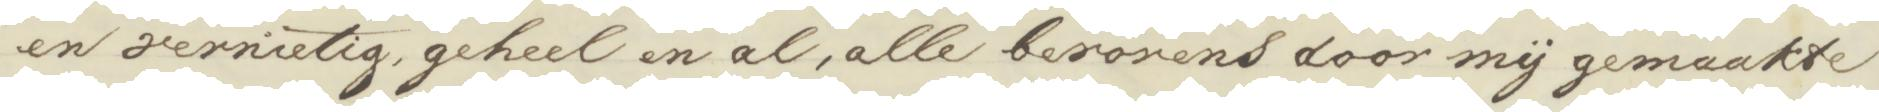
en vernietig, geheel en al, alle bevorens door mij gemaakte
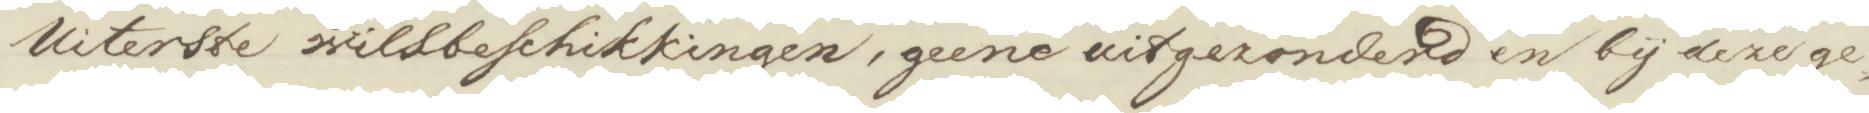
Uiterste wilsbeschikkingen, geene uitgezonderd en bij deze ge
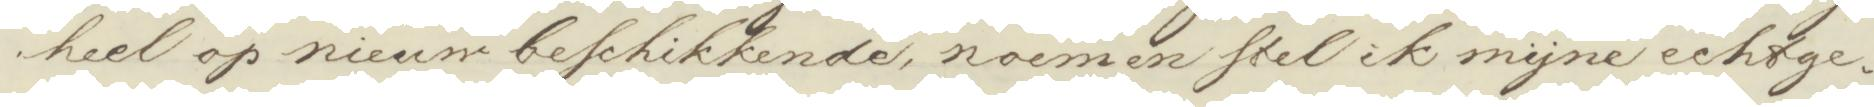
„heel op nieuw beschikkende, noem en stel ik mijne echtge
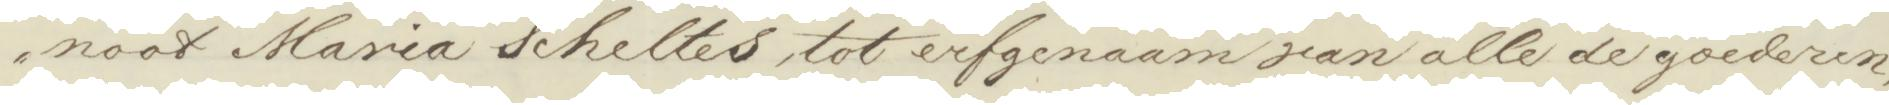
„noot Maria Scheltes, tot erfgenaam van alle de goederen,
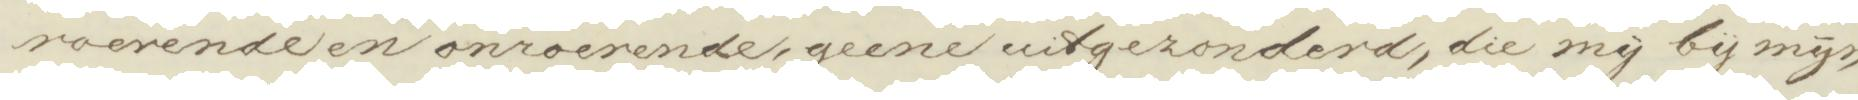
roerende en onroerende, geene uitgezonderd, die mij bij mij
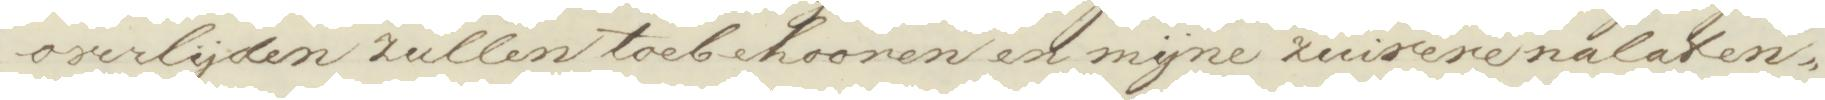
overlijden zullen toebehooren en mijne zuivere nalaten„
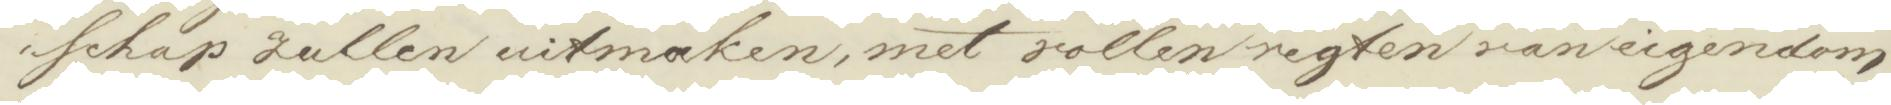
„schap zullen uitmaken, met vollen regten van eigendom
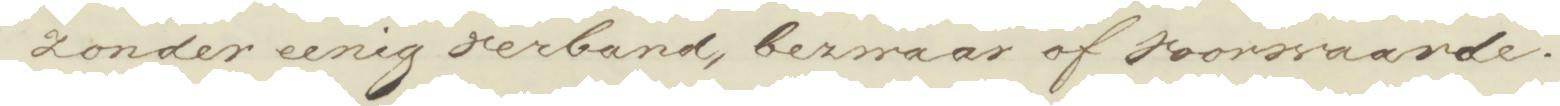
zonder eenig verband, bezwaar of voorwaarde.
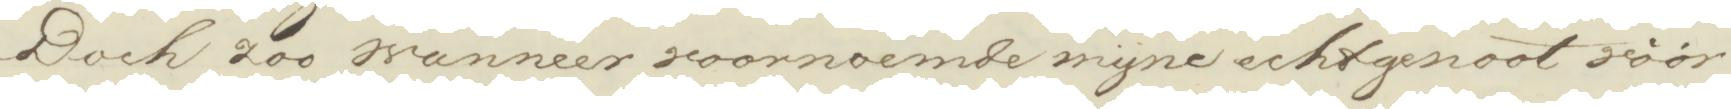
Doch zoo wanneer voornoemde mijne echtgenoot vóór
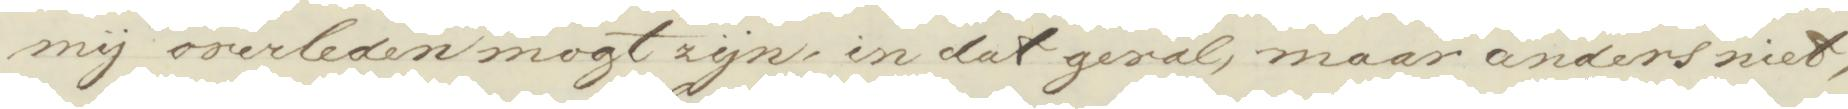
mij overleden mogt zijn, in dat geval, maar anders niet
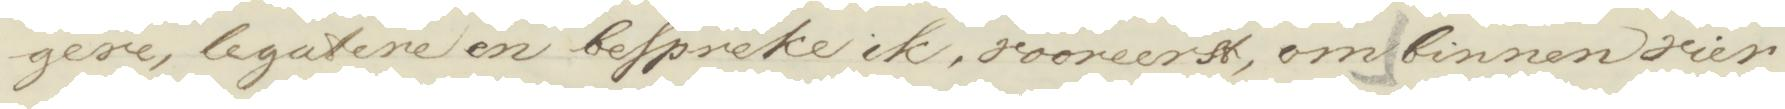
geve, legatere en bespreke ik, vooreerst, om binnen vier
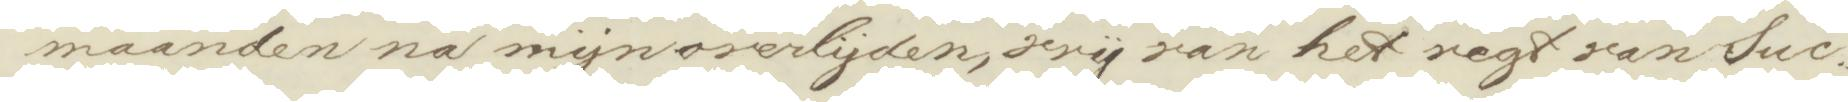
maanden na mijn overlijden, vrij van het regt van suc
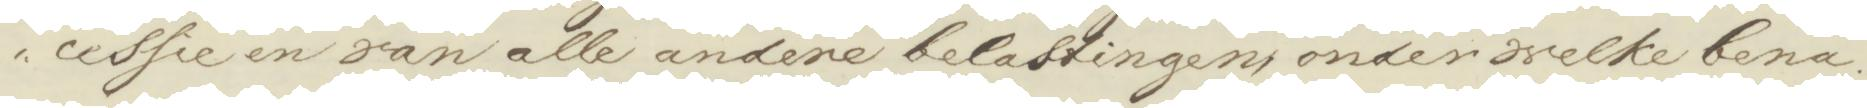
„cessie en van alle andere belastingen, onder welke bena
